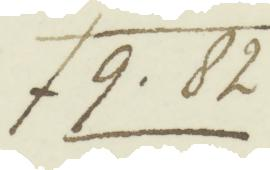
ƒ 9:82
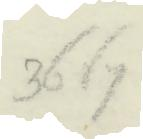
3667
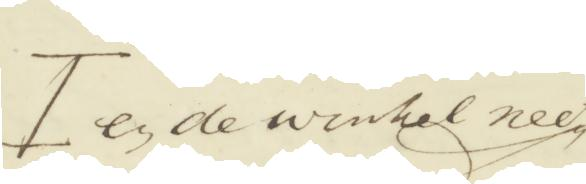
¶ en de winkel nee
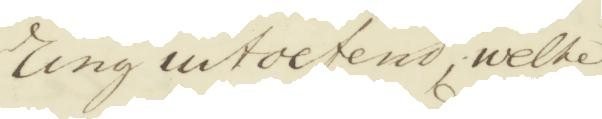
ring uitoefend, welke
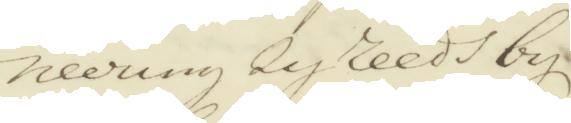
neering zy reeds bij
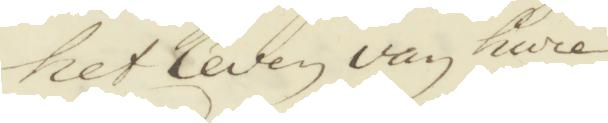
het leven van hare
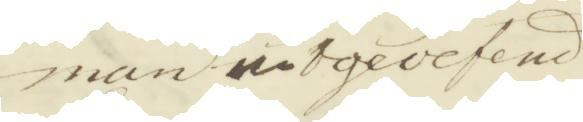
man uitgeoefend
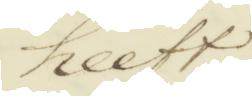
heeft
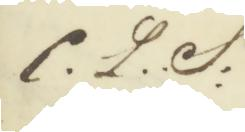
C. L. S.
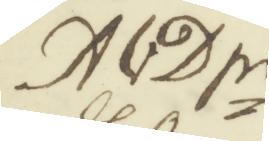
A V D jr=
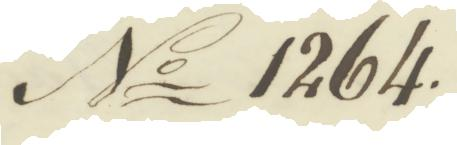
N=o 1264.
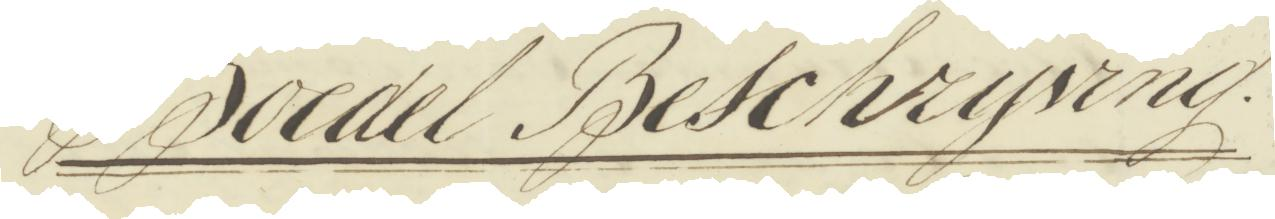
Boedel Beschrijving.
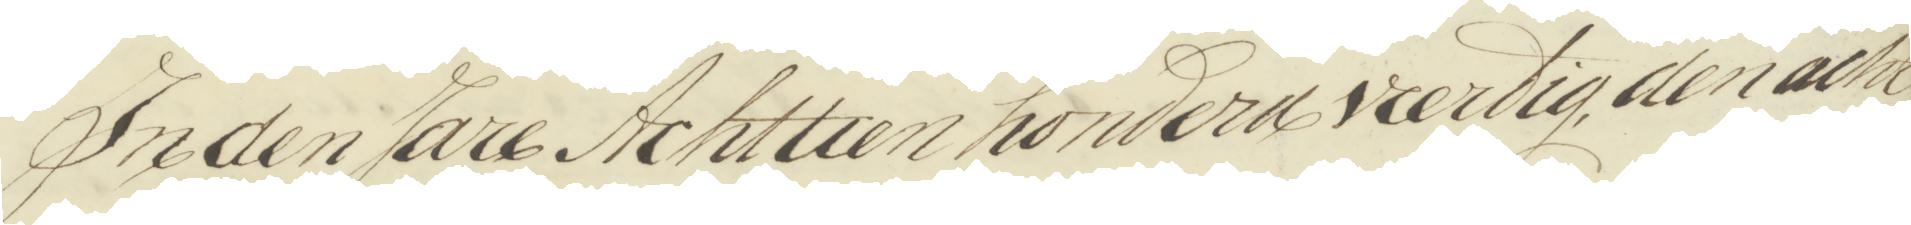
In den Jare Achttien honderd veertig, den acht
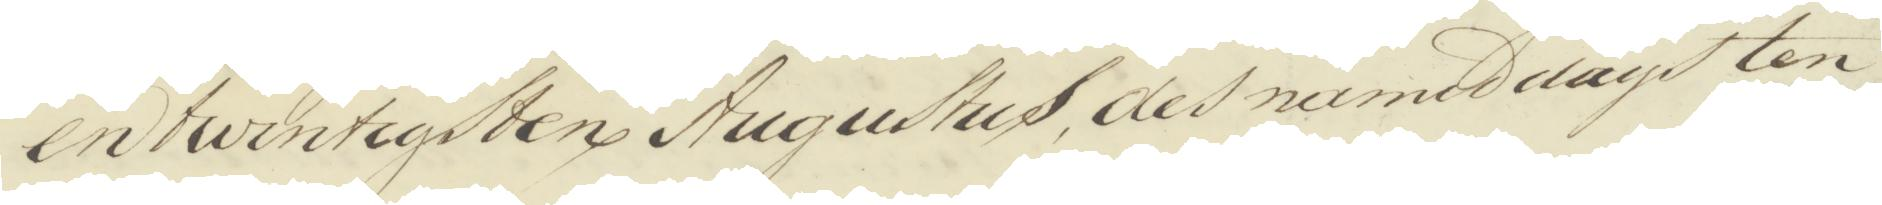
en twintigsten Augustus, des namiddags ten
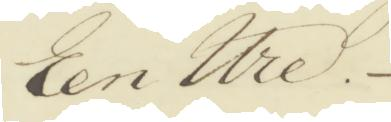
Een Ure.
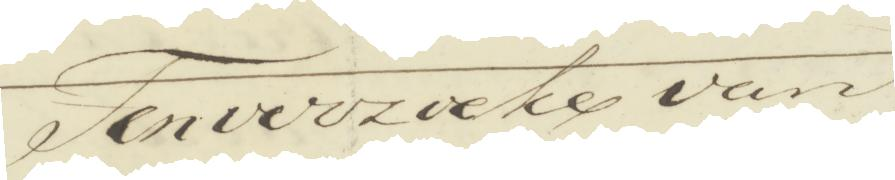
Ten verzoeke van
